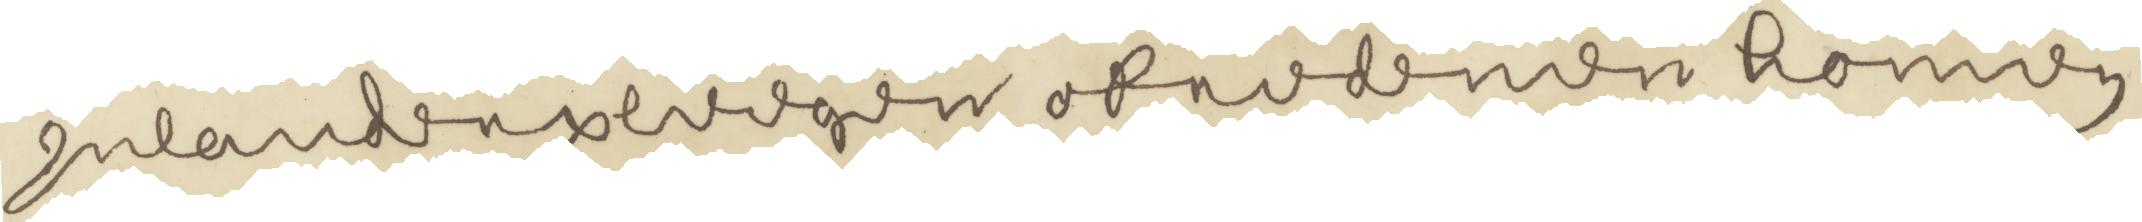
Jnlander pleegen of redenen komen
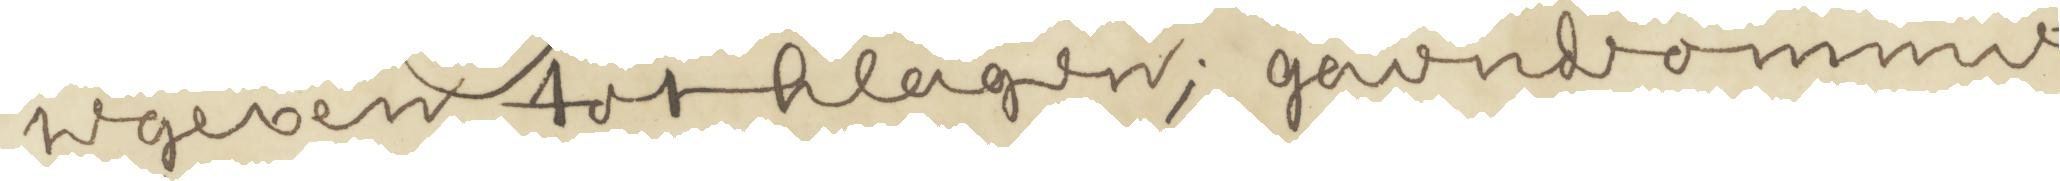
te geven tot klagen; gaende omme
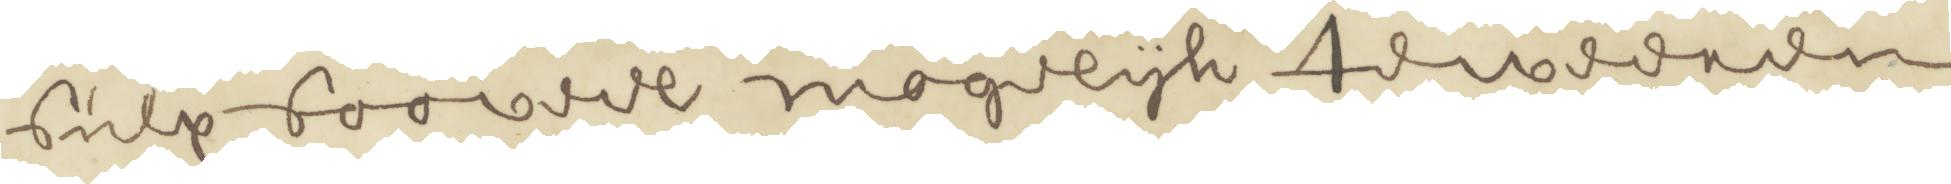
sulx sooveel mogelijk te weeren
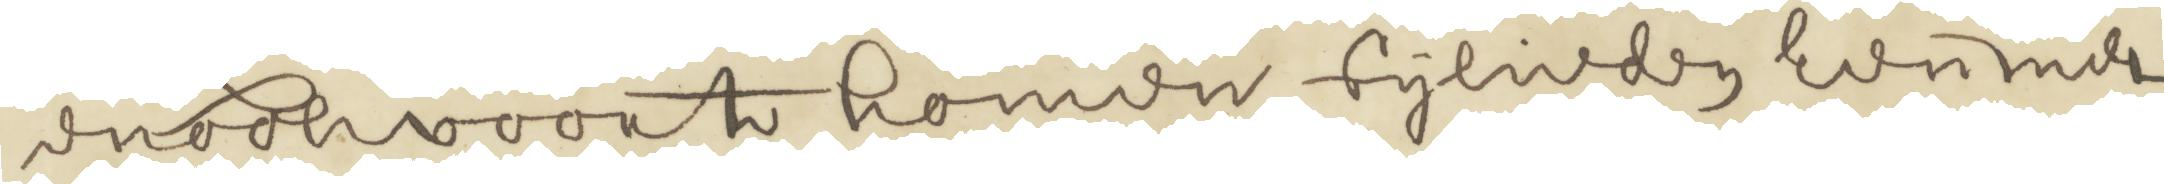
en ook voor te komen sijlieden hen niet
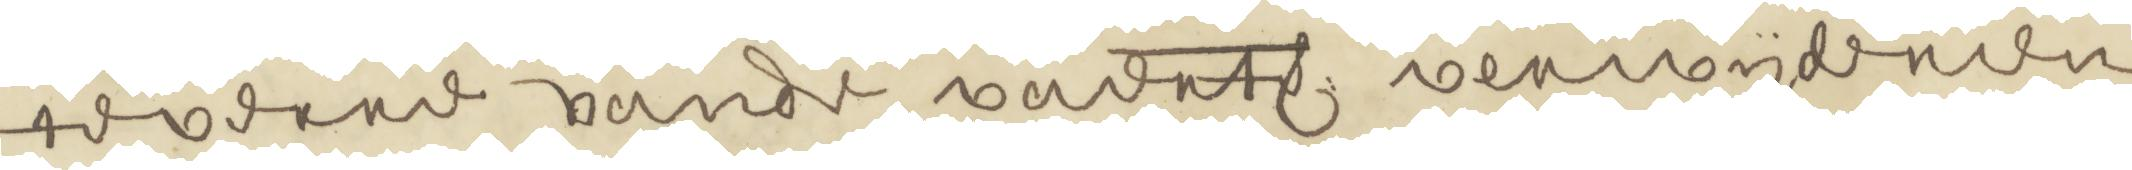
te verre vande vaertver: verwijderen
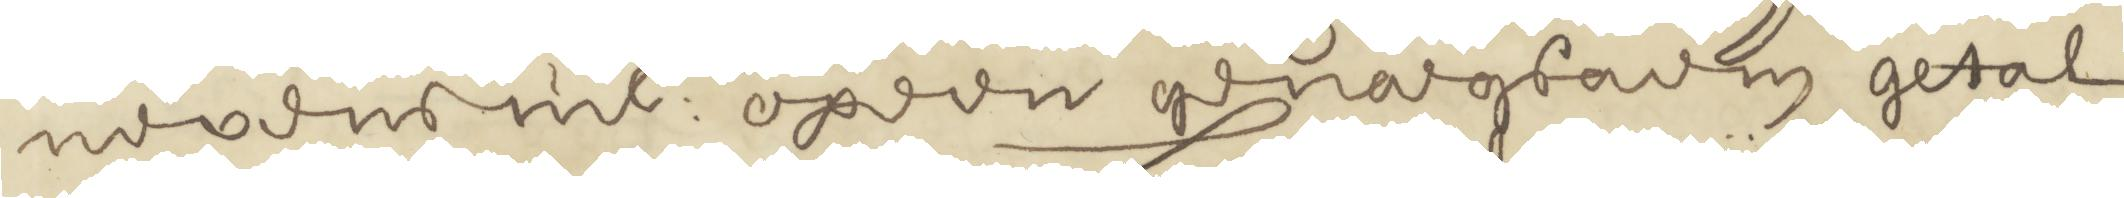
nevens uE: op een genoegsaem getal
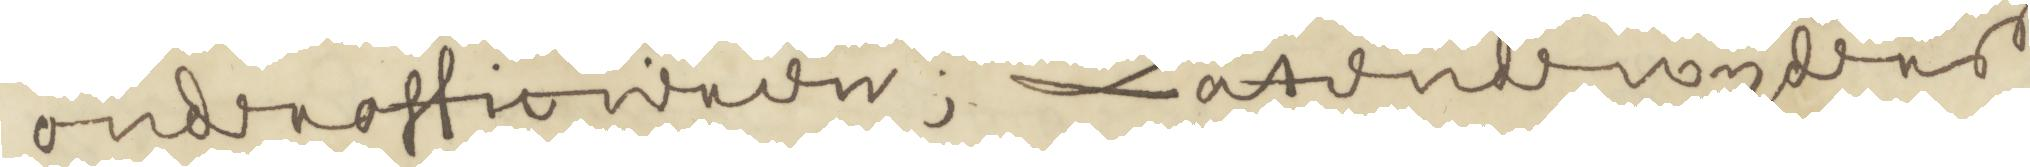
onderofficieren; Latende wijders
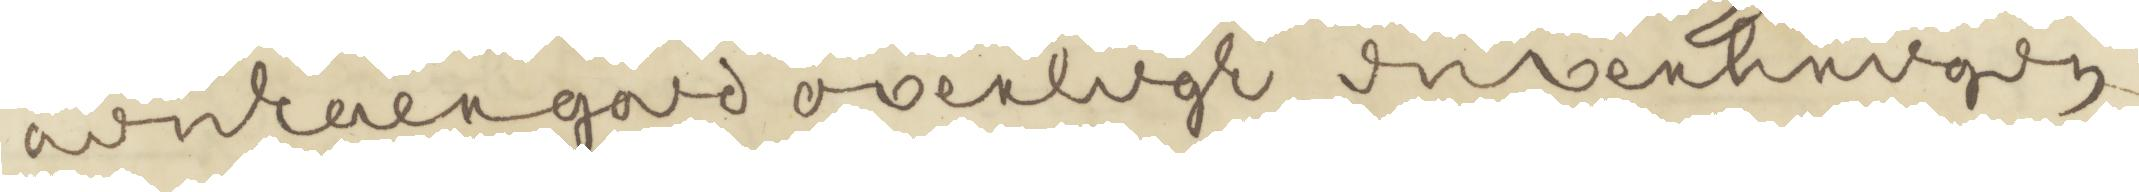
aen haer goed overlegh en verkregen
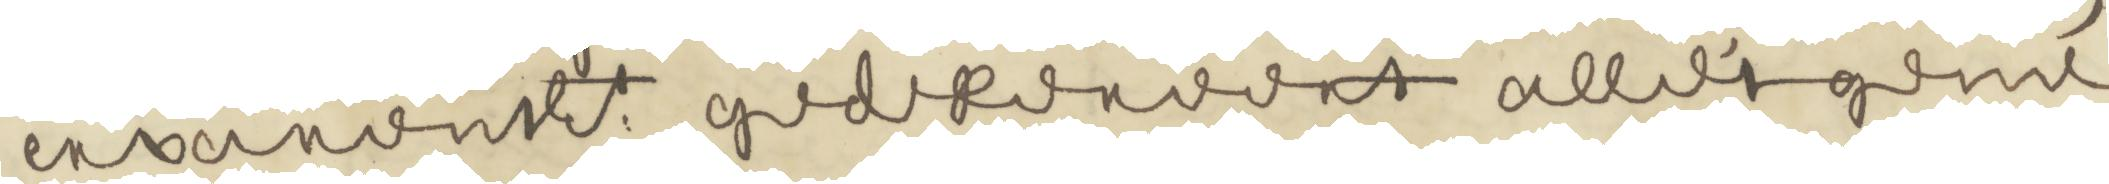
ervarenth:t gedefereert alle 'tgene
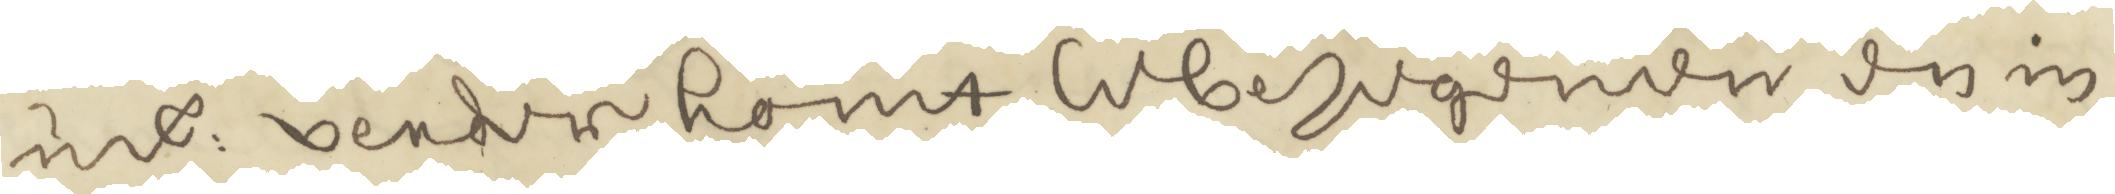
uE: verder komt te bejegenen en in
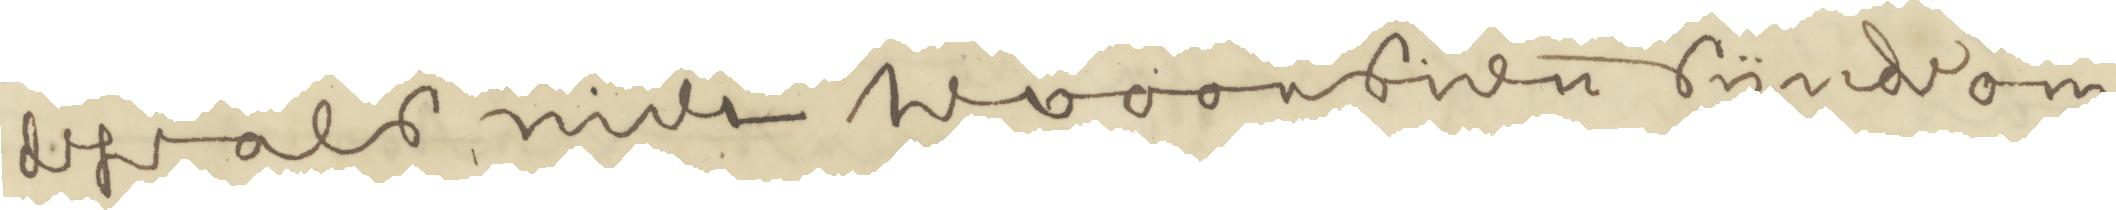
dese als niet te voorsien sijnde om
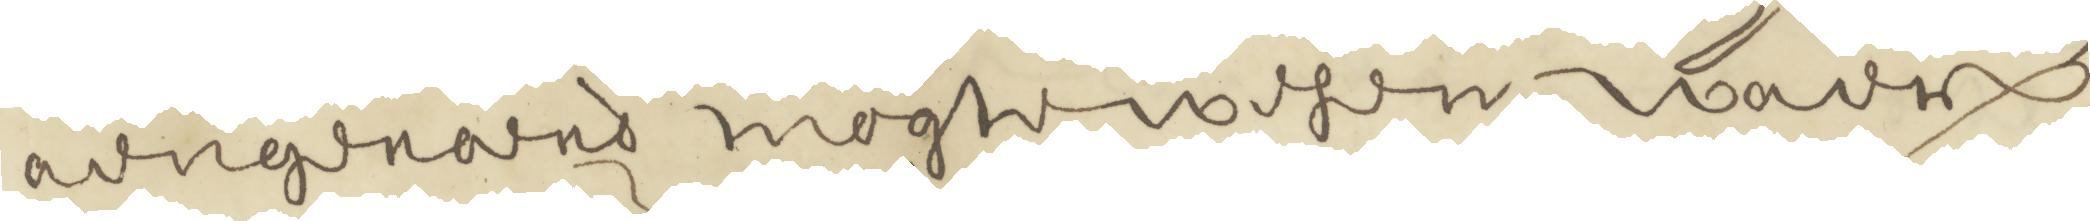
aengeroerd mogte wesen, waer —
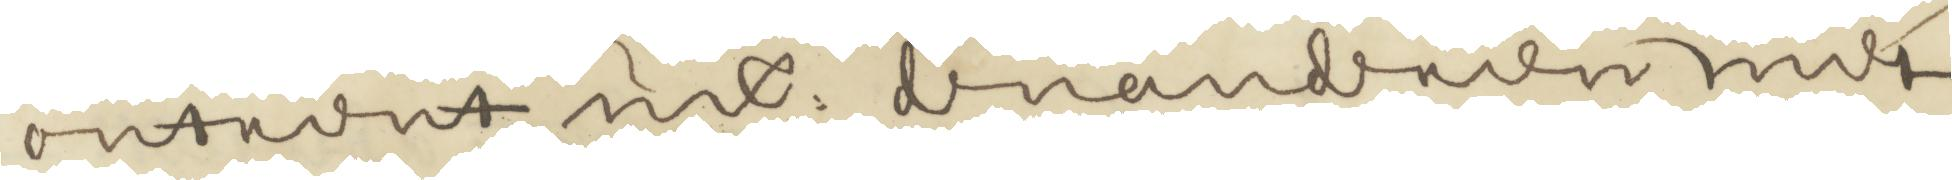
ontrent uE: den anderen met
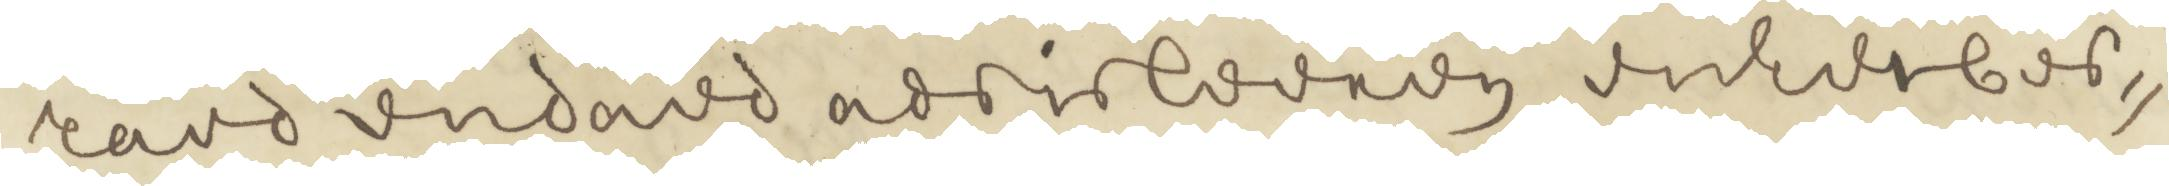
raed en daed adsisteeren en het bes„
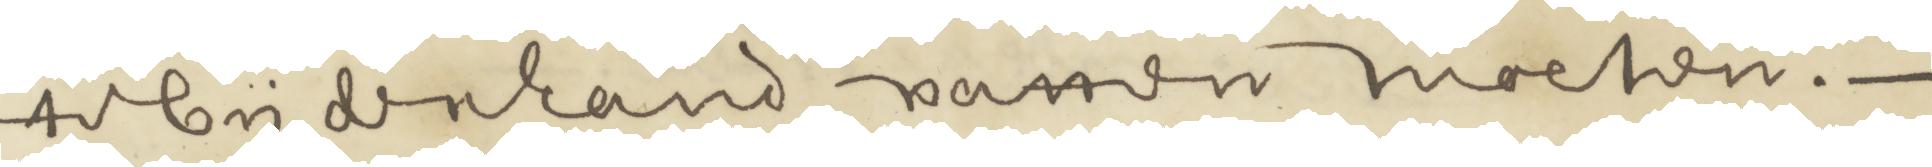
te bij der hand vatten moeten. —
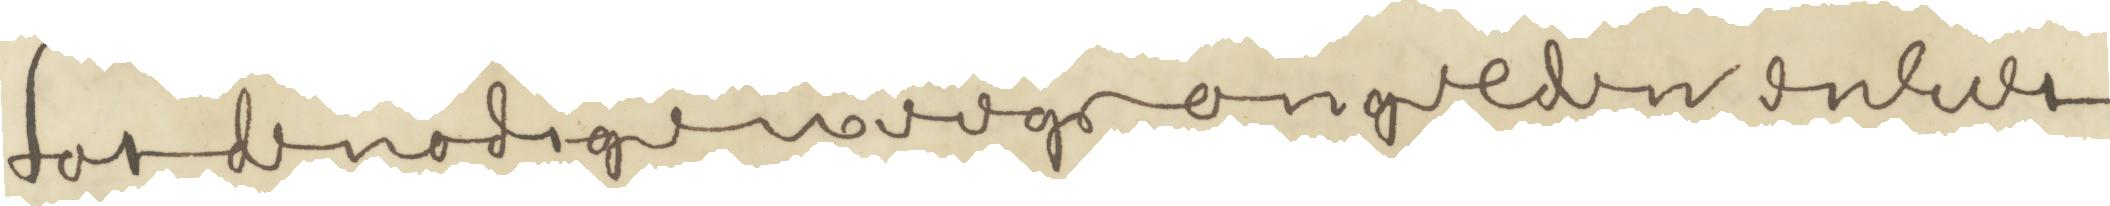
tot de nodige weegs ongelden en het
